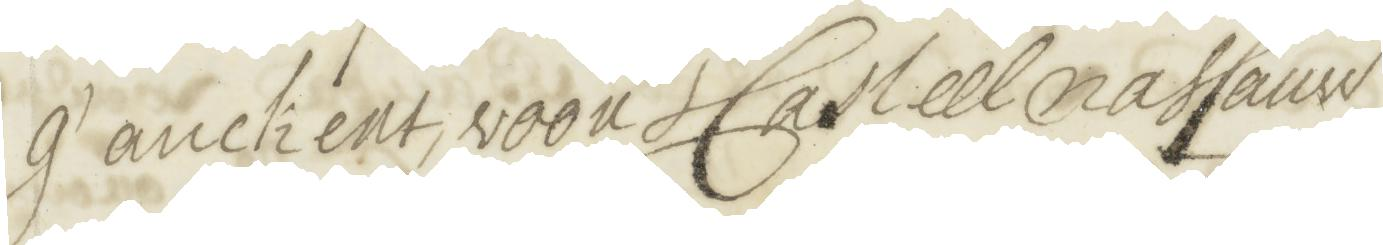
g’anckert, voor 't Casteel nassauw
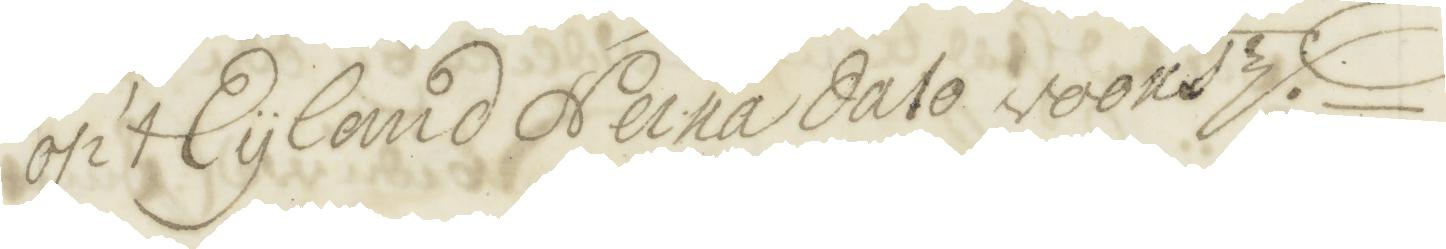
op ’t Eijland Neira dato voorsz. —
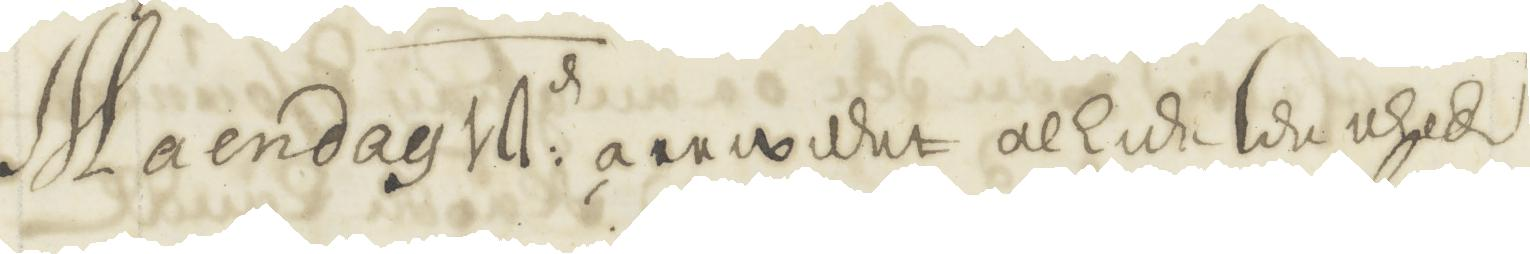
Maendag 14:en arriveert alhier ter rhede
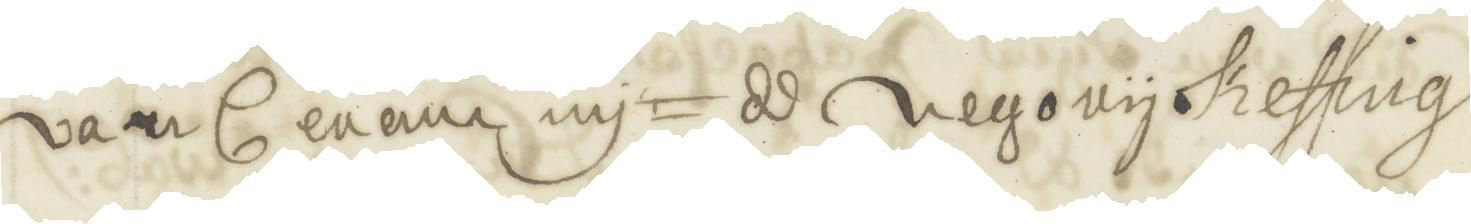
van Ceram uijt de negorij keffing
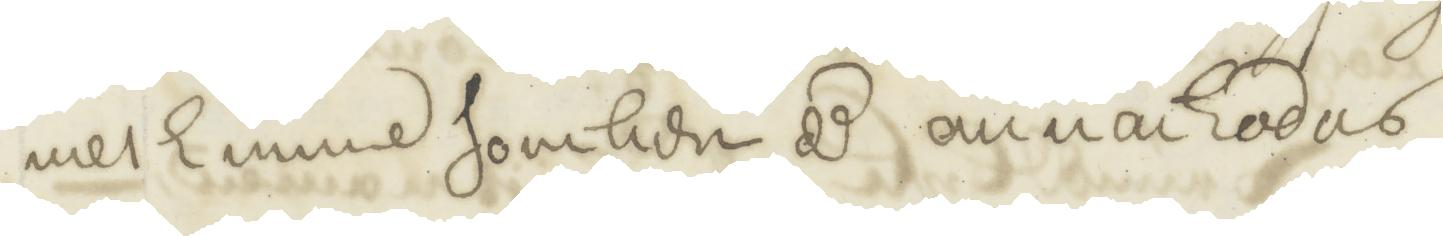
met hunne Jonken de annachodas
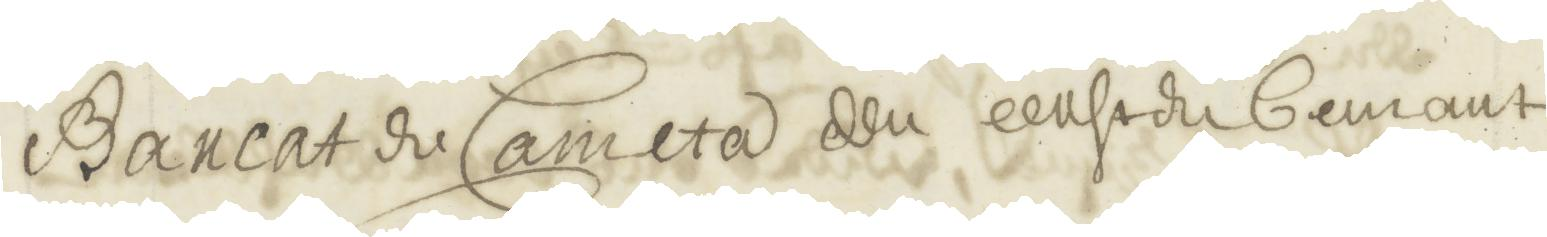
Barcat en Cameta den eersten bemant
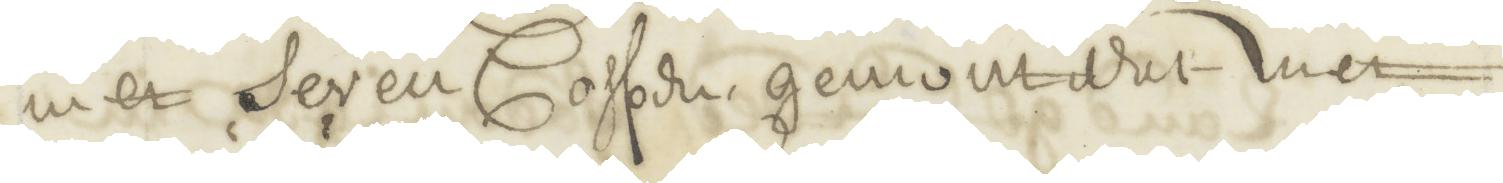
met seven Coppen, gemonteert met
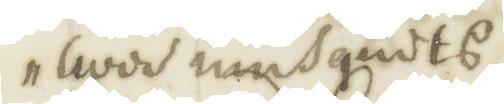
„ twee musquets
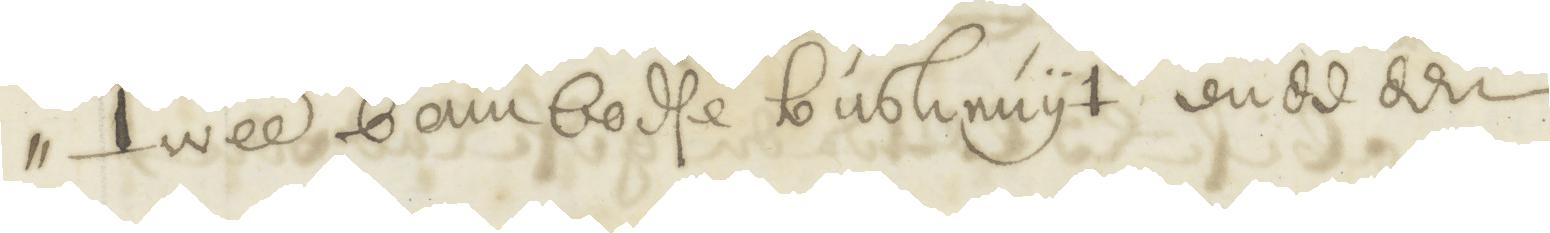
„ twee bamboese buskruijt en de den
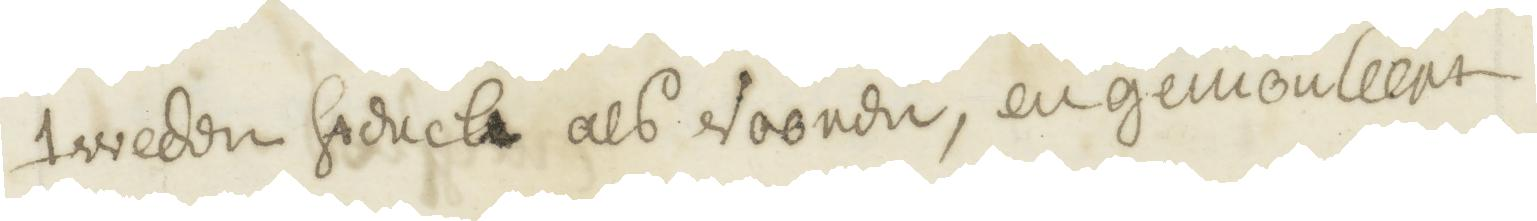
tweden sterck als vooren, en gemonteert
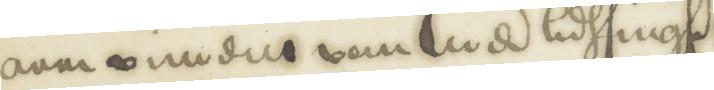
aan vincent van twee liessingse
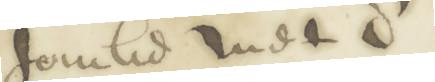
jomke met d’
